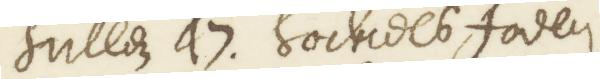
sullen 47. sockels foelij
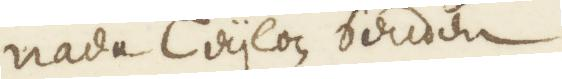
naer Ceijlon senden
